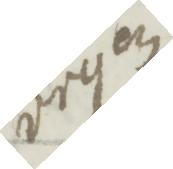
vrijen
